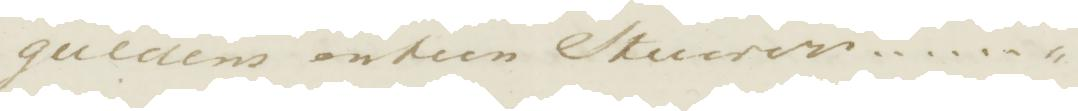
guldens en tien Stuivers - - - - - - „
